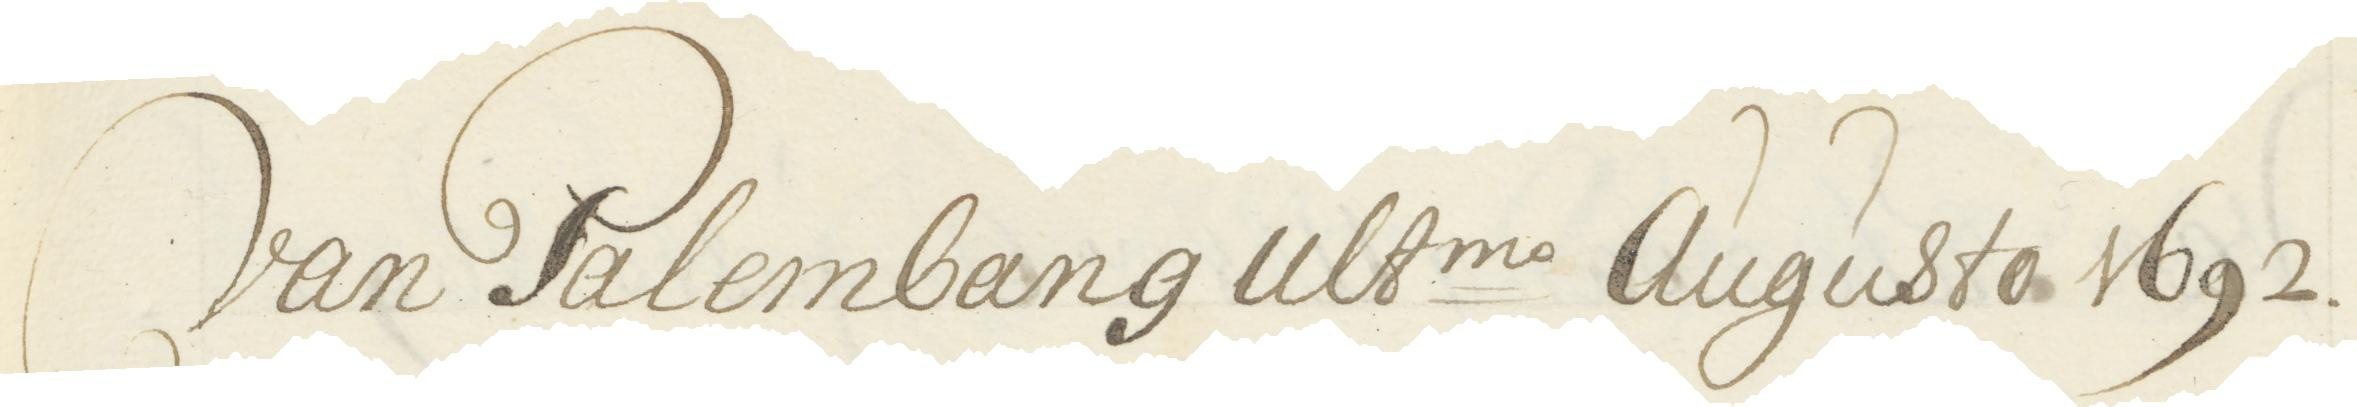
Van Palembang ult=mo Augusto 1692.
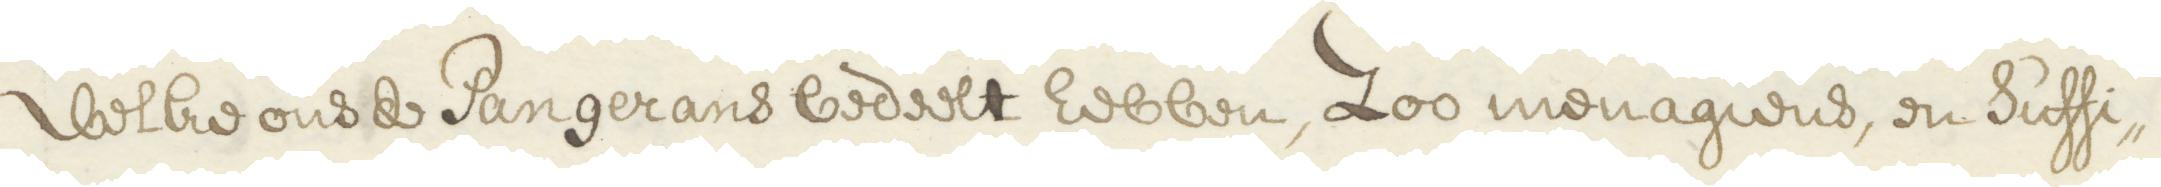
welke ons de Pangerans bedeelt hebben, Zoo menagieus, en suffi„
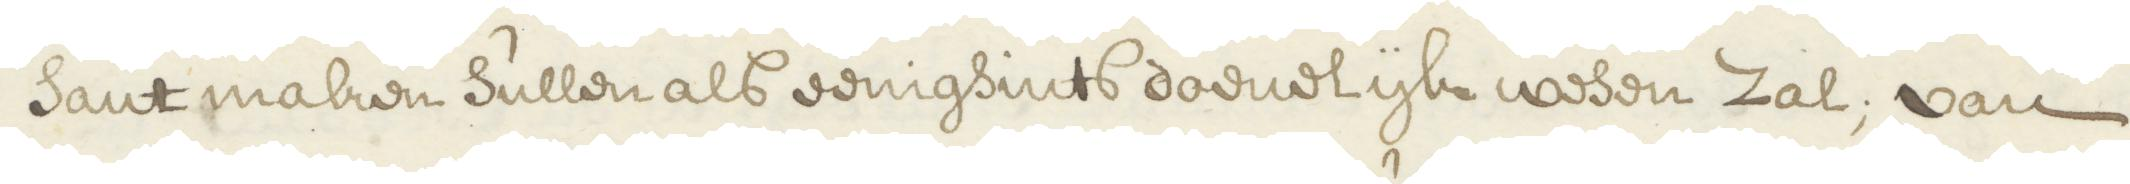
sant maken sullen als eenigsints doenelijk wesen zal; van
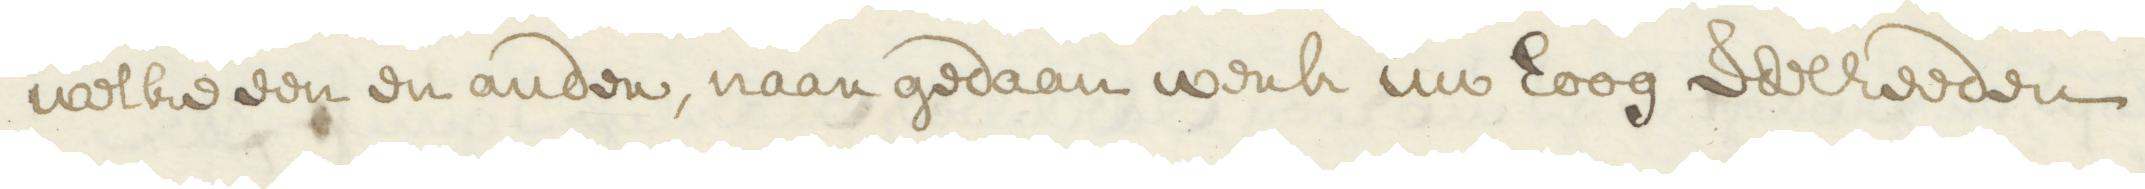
welke een en ander, naar gedaan werk uw hoog Edelheeden
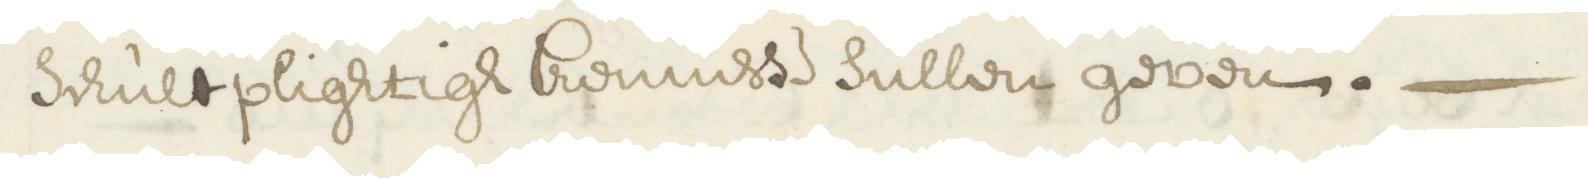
schultplightigh kennisse sullen geven. —
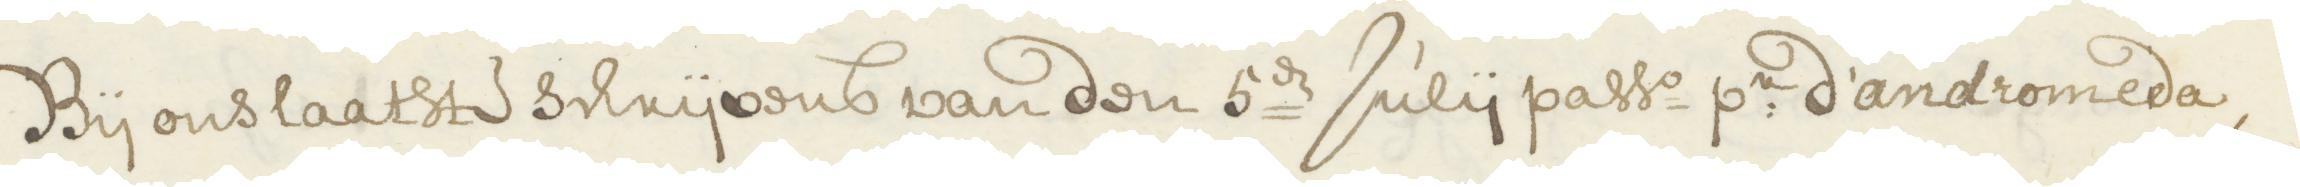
Bij ons laatste schrijvens van den 5=en Julij pass=o p:r d’andromeda,
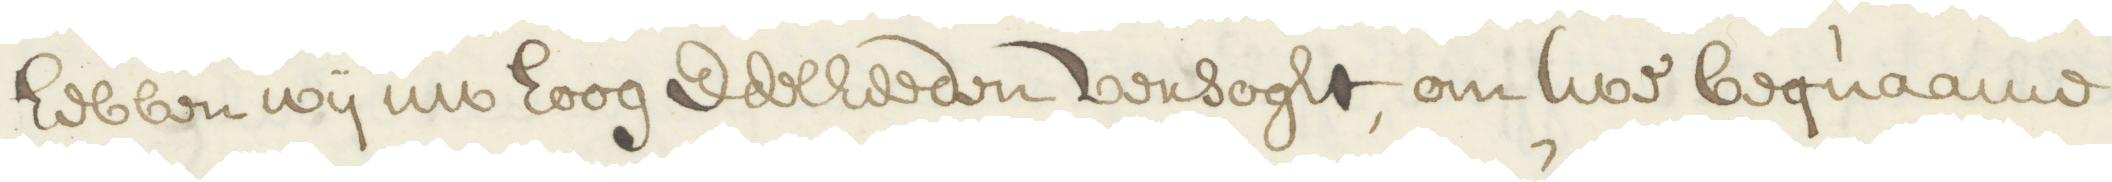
hebben wij uw hoog Edelheeden versoght, om twe bequaame
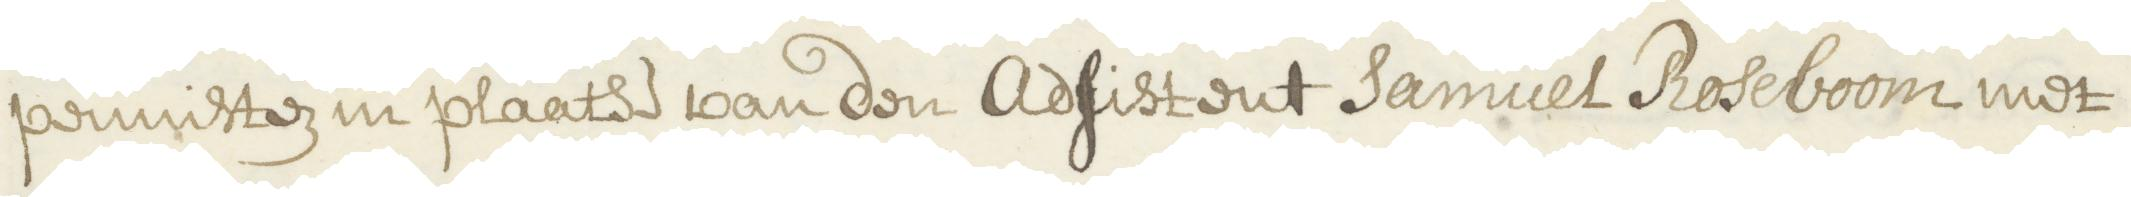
pennisten in plaatse van den Adsistent Samuel Roseboom met
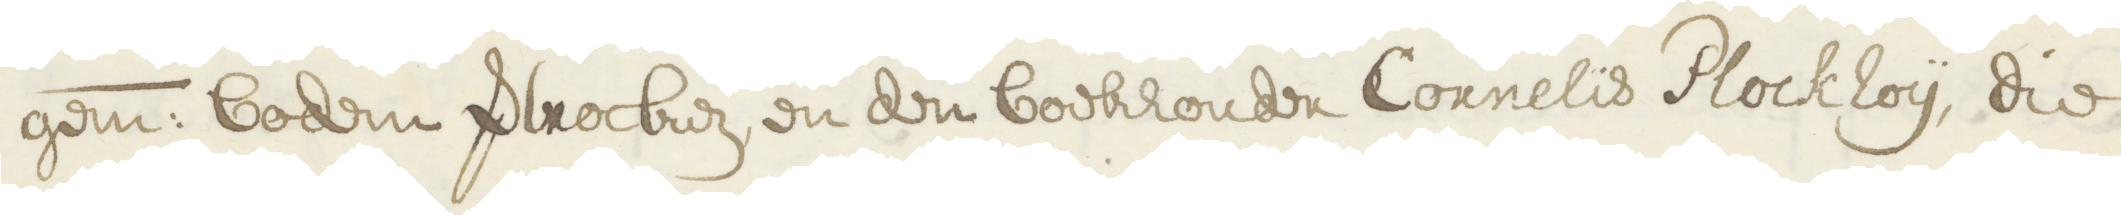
gem: bodem vertrocken, en den boekhouder Cornelis Plockhoij, die
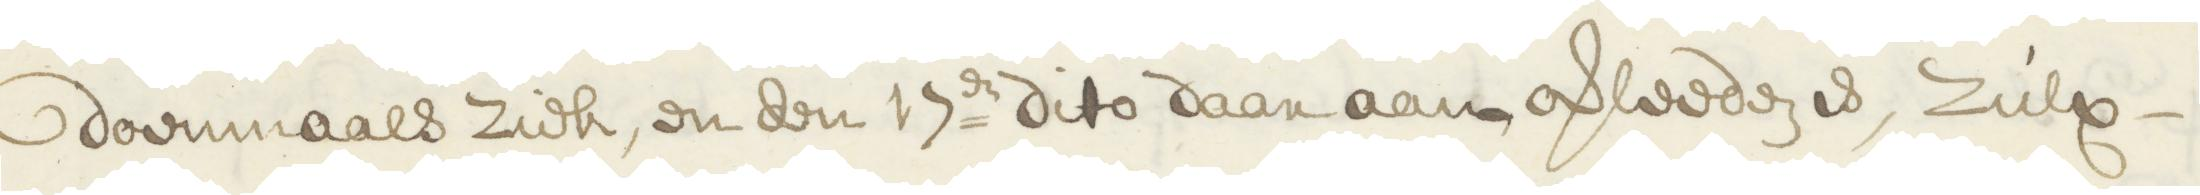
doenmaals ziek, en den 17=en dito daar aan overleeden is, zulx —
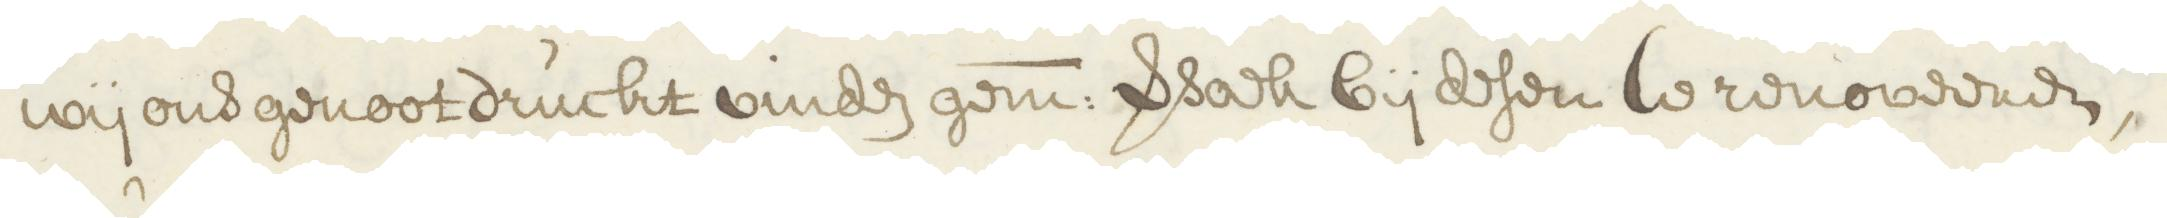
wij ons genootdruckt vinden gem: versoek bij desen te renoveeren„
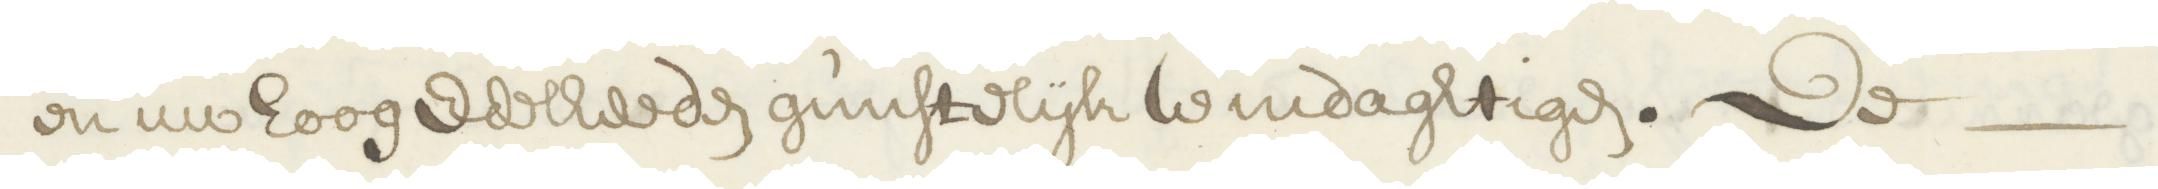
en uw hoog Edelheeden gunstelijk te indaghtigen. De —
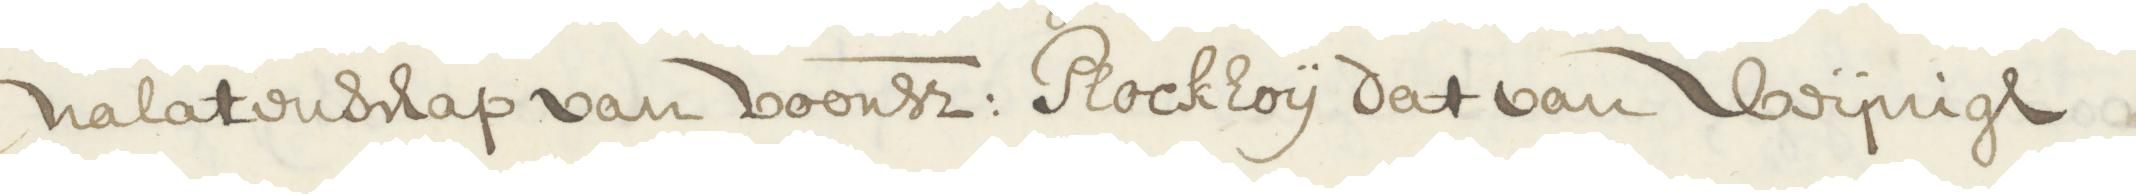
nalatenschap van voorsz: Plockhoij dat van weijnigh
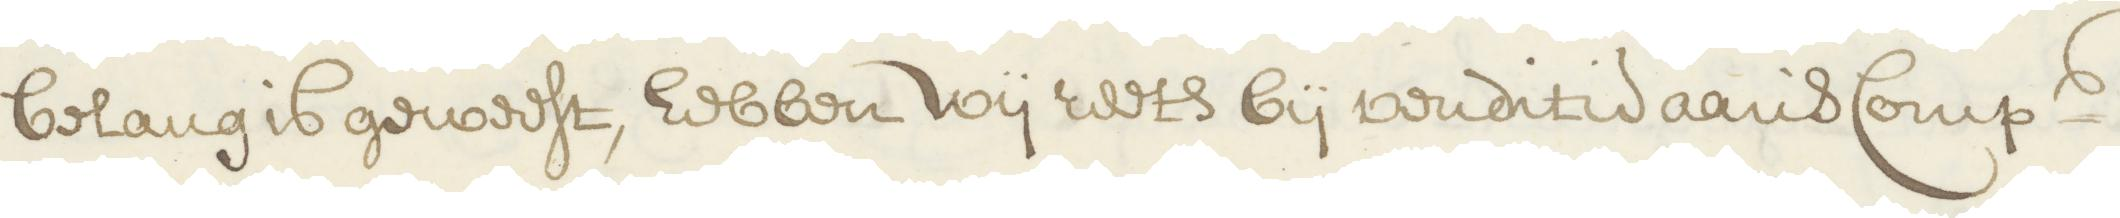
belang is geweest, hebben wij reets bij venditie aan ’s Comp=s
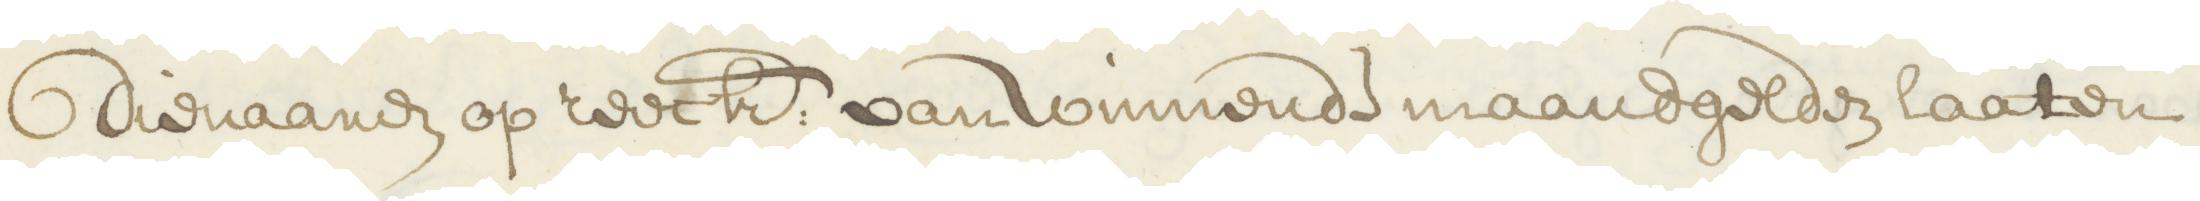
dienaaren op reeck: van winnende maandgelden laaten
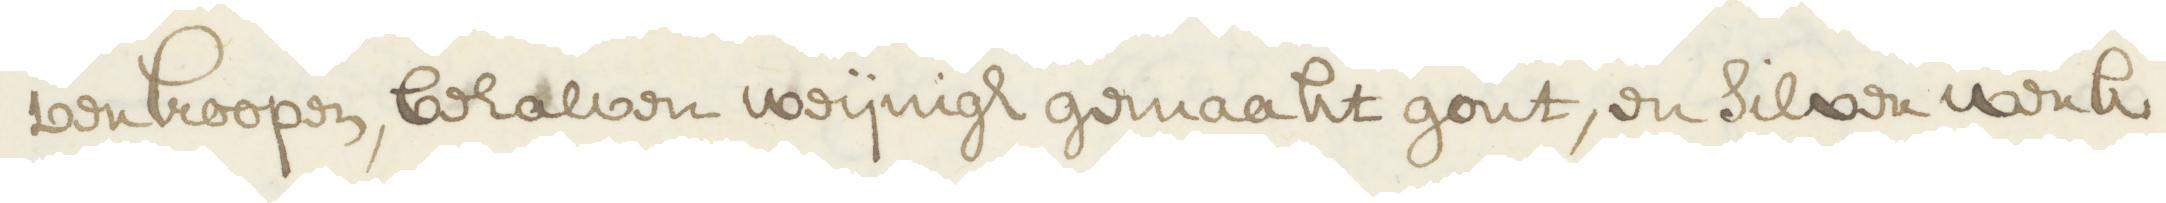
verkoopen, behalven weijnigh gemaakt gout, en silver werk
